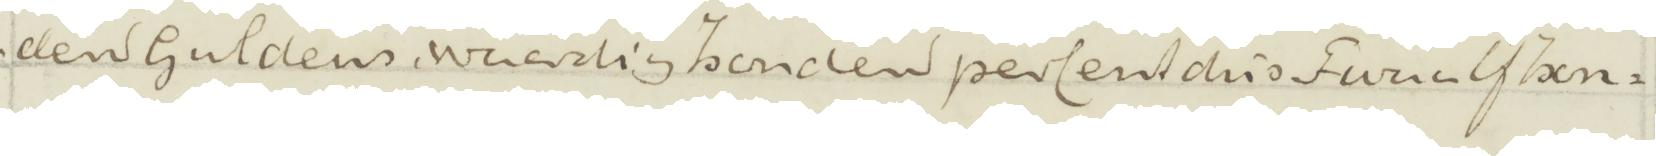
-derd Guldens, waardig honderd percent dus Twaalf hon=
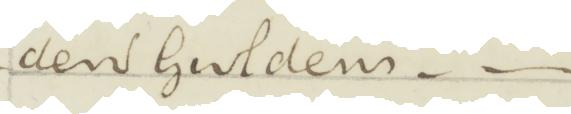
-derd Guldens - - - - - - - - - - - - - - - - - - „ 1200 „ –
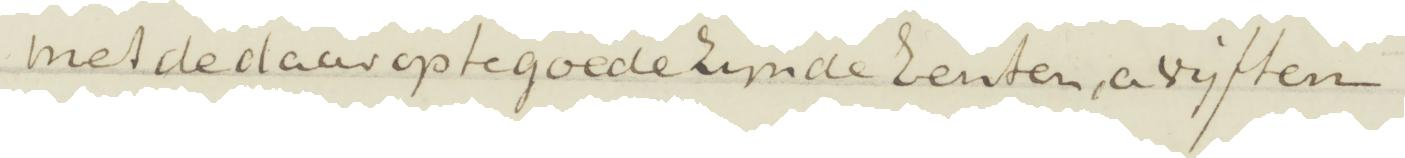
met de daar op te goede zynde renten, a vijften
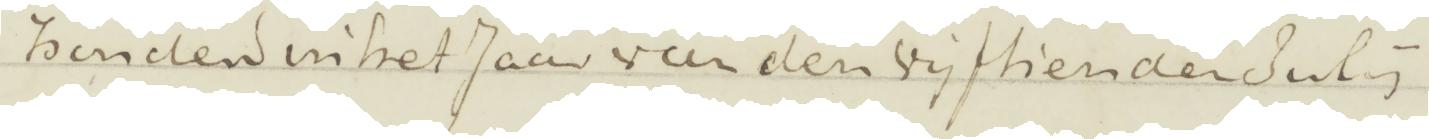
honderd in het Jaar van den vijftienden Julij
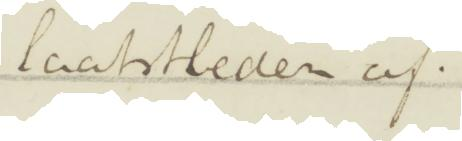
laatstleden af.
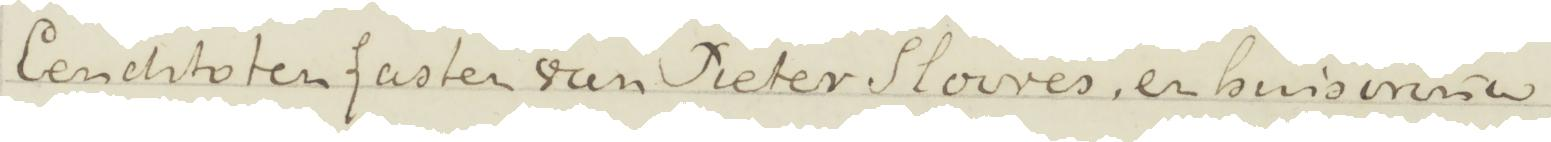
Een dito ten Lasten van Pieter Slooves, en huisvrouw
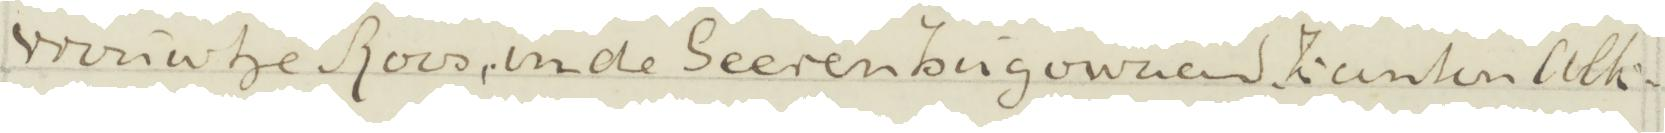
wouwtje Roos, in de heeren hugowaard kanton Alk-
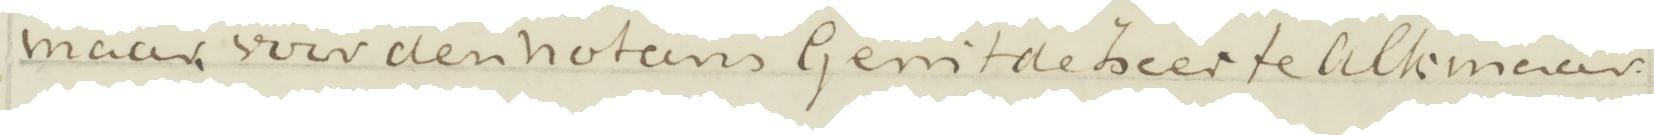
maar voor den notaris Gerrit de heer te Alkmaar
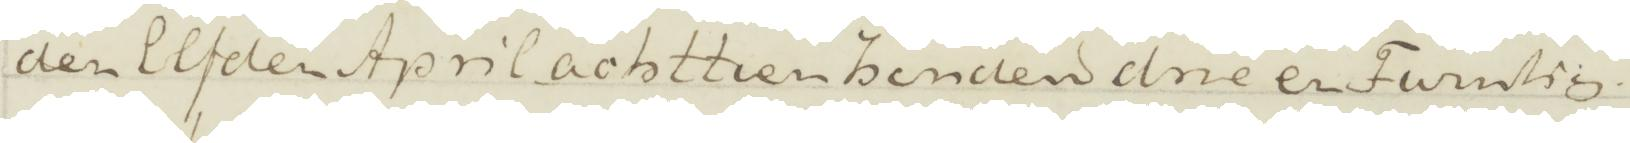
der Elfden April achttien honderd drie en Twintig
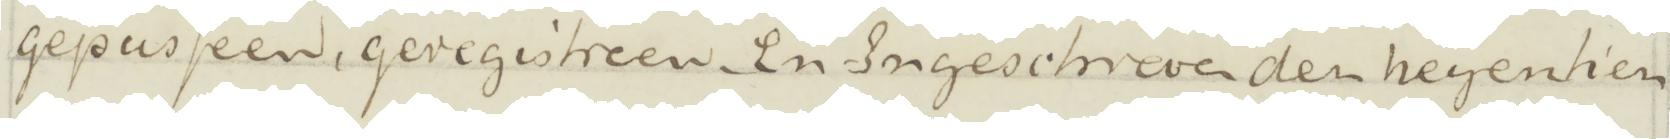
gepasseerd, geregistreerd. En Jngeschreve den negentien
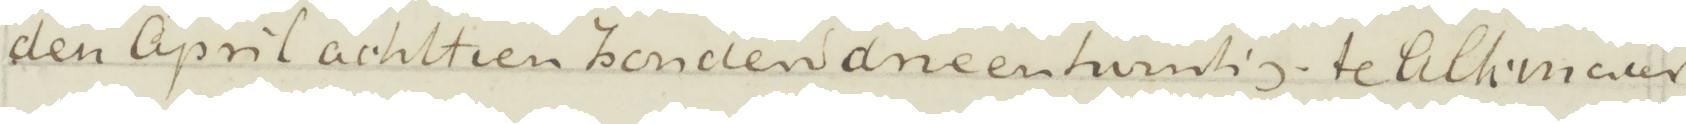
den April achttien honderd drie en twintig te Alkmaar
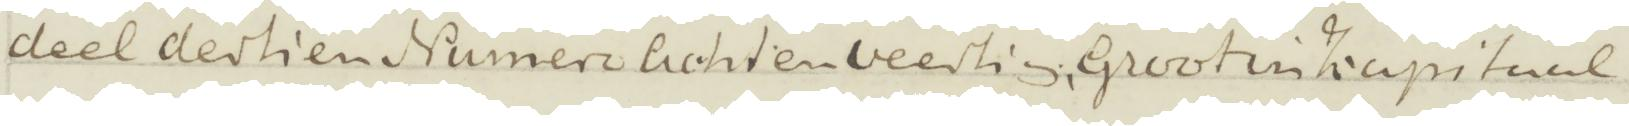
deel dertien Numero acht en veertig, Groot in kapitaal
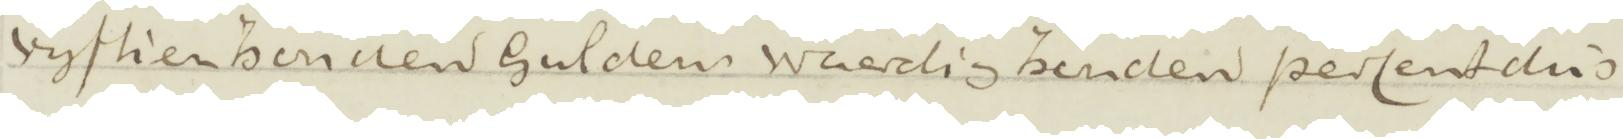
vyftien honderd Guldens waardig honderd percent dus
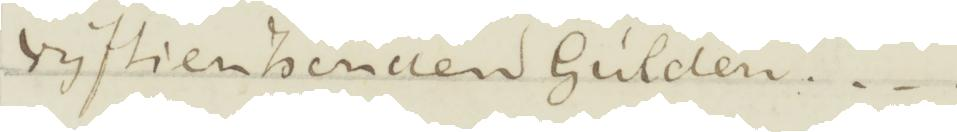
vijftien honderd Gulden . - - - - - - - - - - - - - „ 1500. —
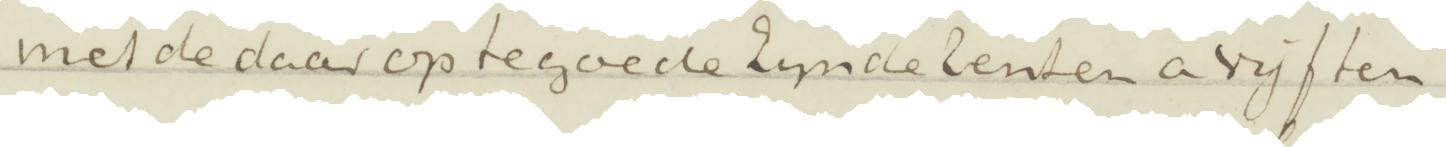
met de daar op te goede zynde renten a vijften
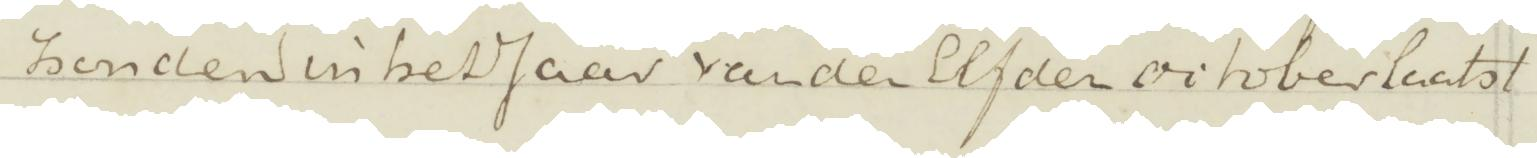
honderd in het Jaar van der Elfder october laatst
